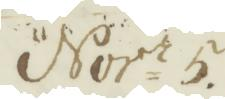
Nov=r 5.
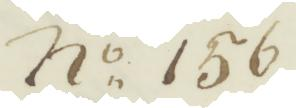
n„o 156.
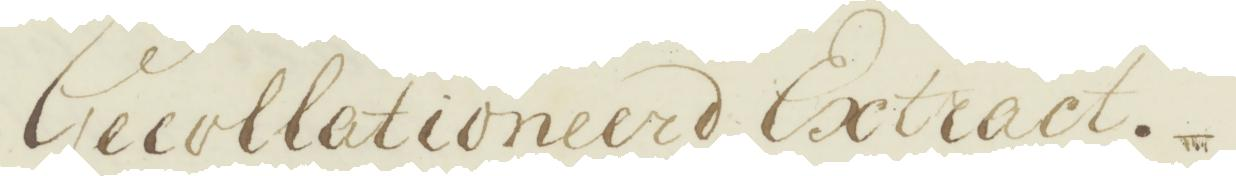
Gecollationeerd Extract. „
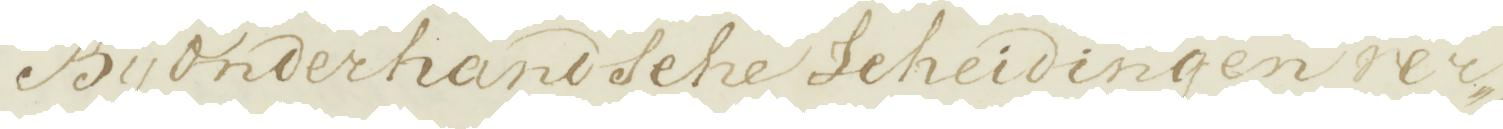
Bij onderhandsche Scheiding en ver„
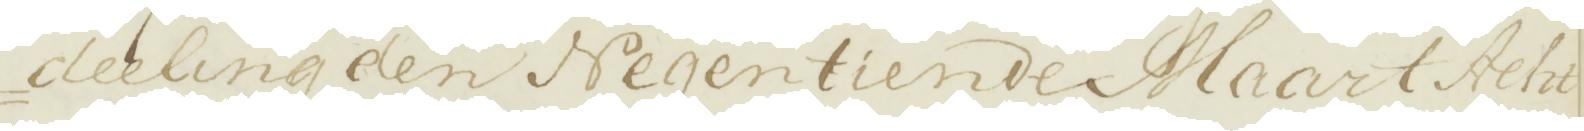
=deeling den Negentiende Maart Acht
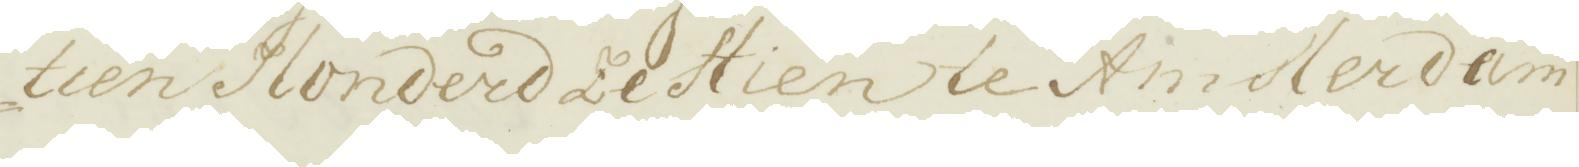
=tien Honderd Zestien te Amsterdam
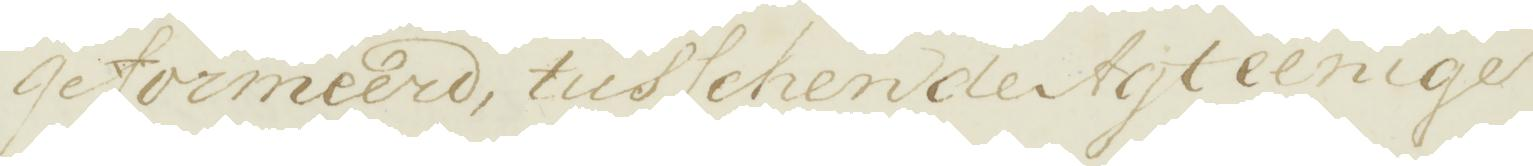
geformeerd, tusschen de Agt eenige
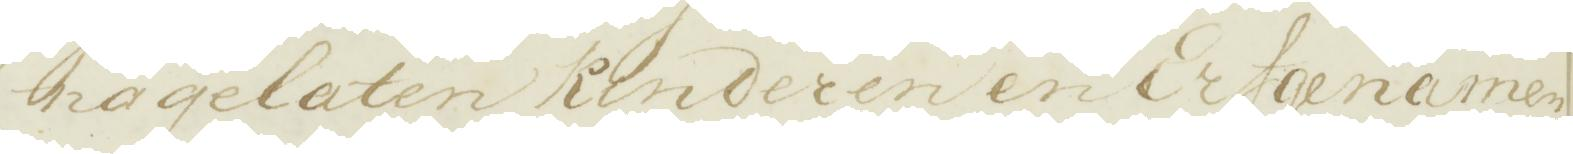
nagelaten kinderen en Erfgenamen
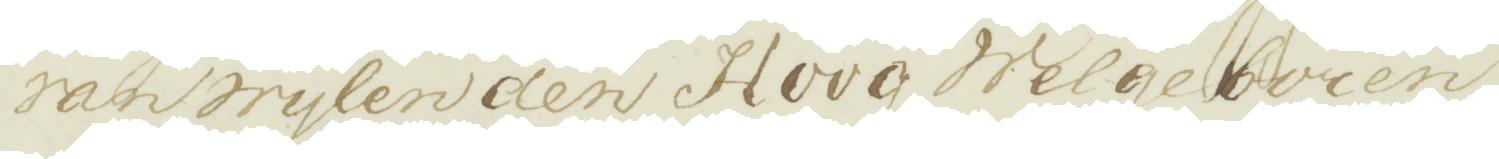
van wijlen den Hoog Welgeboren
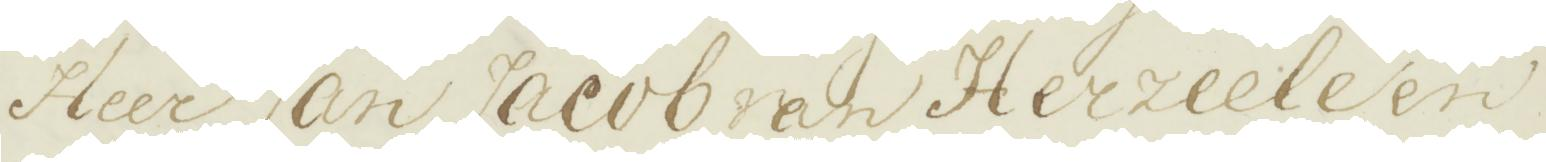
Heer Jan Jacob van Herzeele en
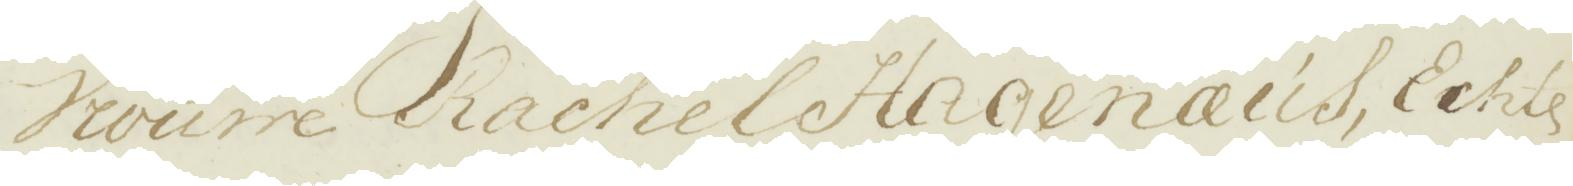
Vrouwe Rachel Hagenaus, Echte
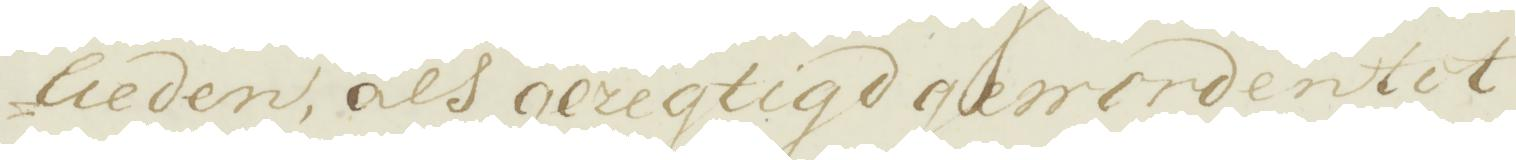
=lieden, als geregtigd geworden tot
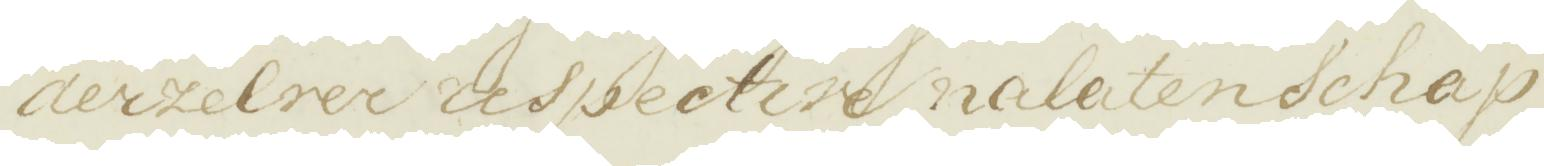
derzelver respective nalatenschap
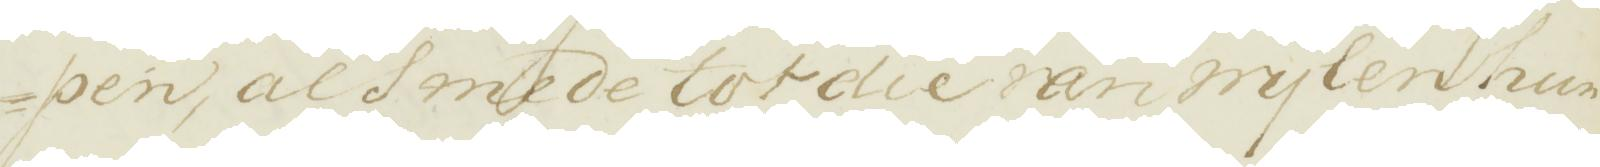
=pen, alsmede tot die van wijlen hun
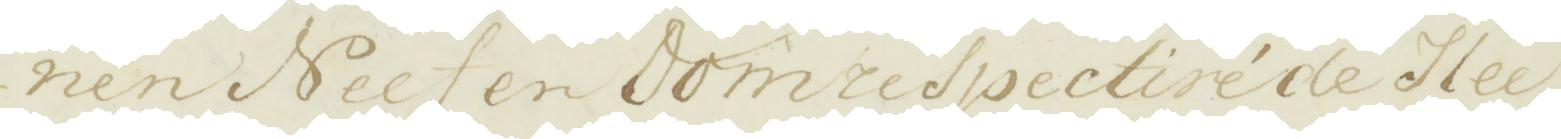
nen Neef en Oom respectivé de Hee
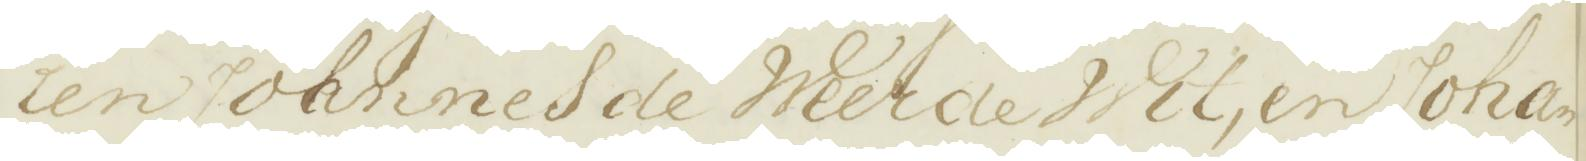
ren Joannes de Weer de Wit, en Johan
